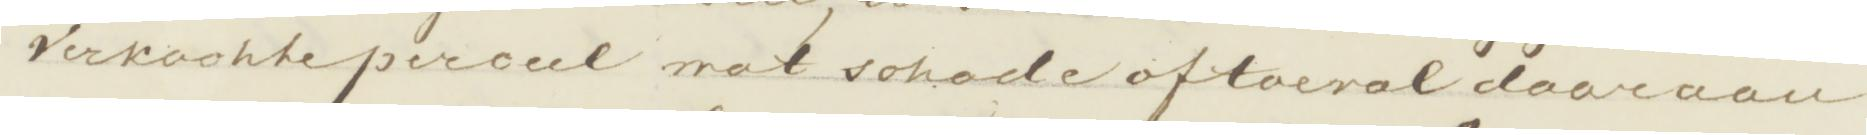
verkochte perceel wat schade of toeval daaraan
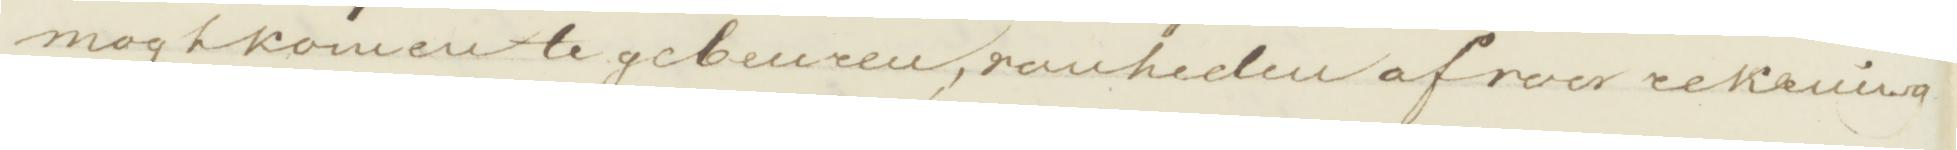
mogt komen te gebeuren, van heden af voor rekening
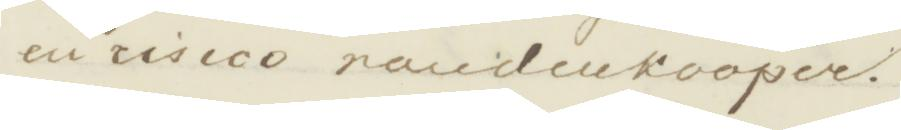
en risico van den kooper.
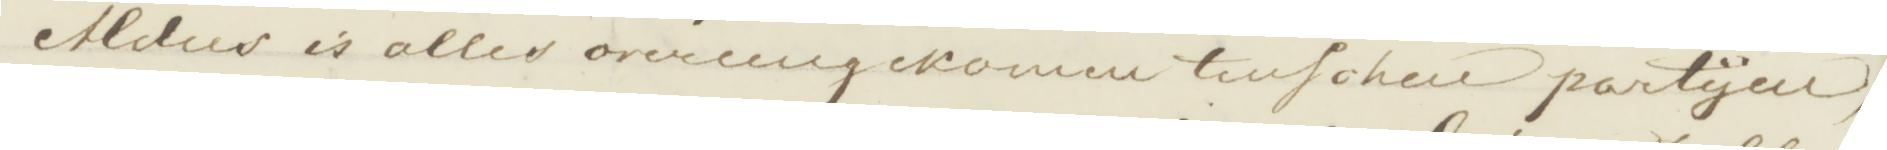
Aldus is alles overeengekomen tusschen partijen,
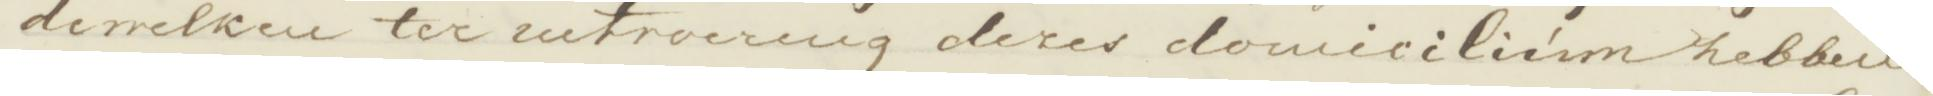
dewelken ter uitvoering dezes domicilium hebben
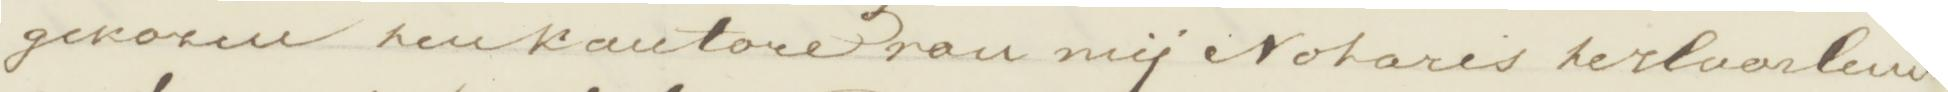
gekozen ten kantore van mij Notaris te Haarlem
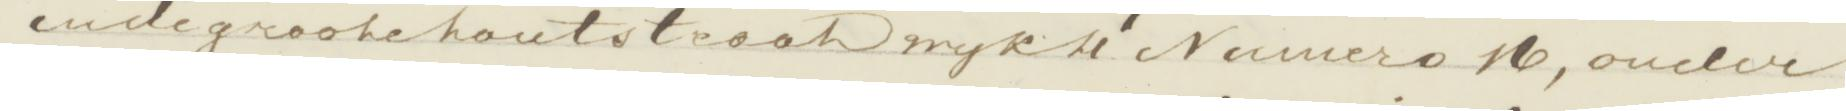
in de groote houtstraat wyk 4 Numero 16, onder
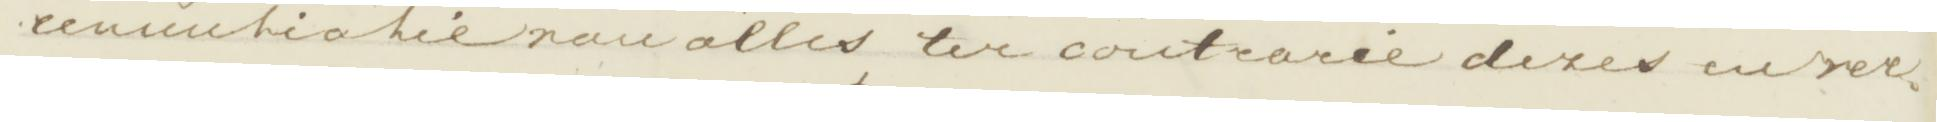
renuntiatie van alles ter contrarie dezes en ver
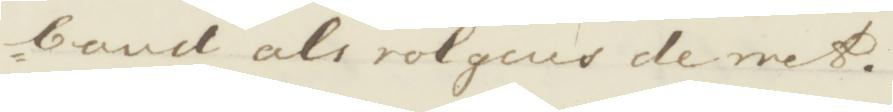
=band als volgens de wet.
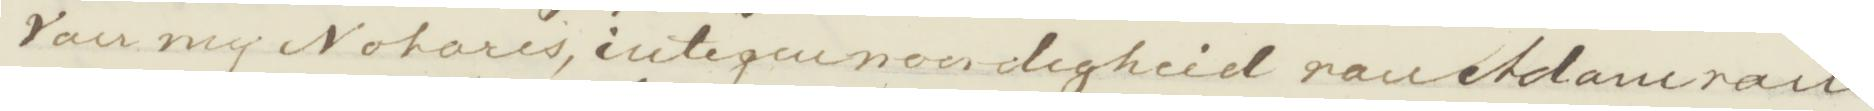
van my Notaris, integenwoordigheid van Adam van
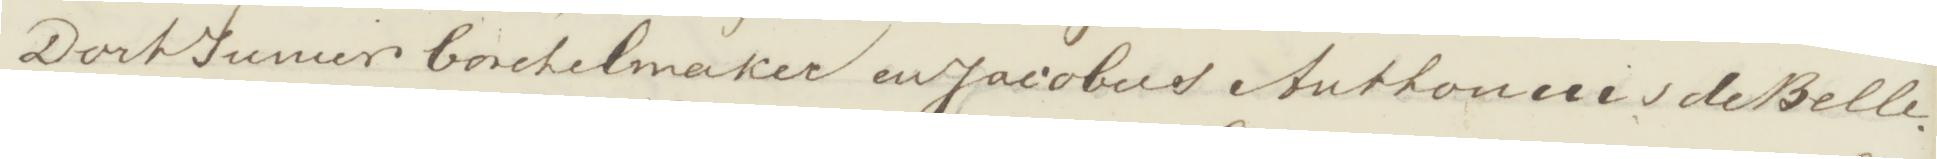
Dort Junior borstelmaker en Jacobus Anthonius de Belle,
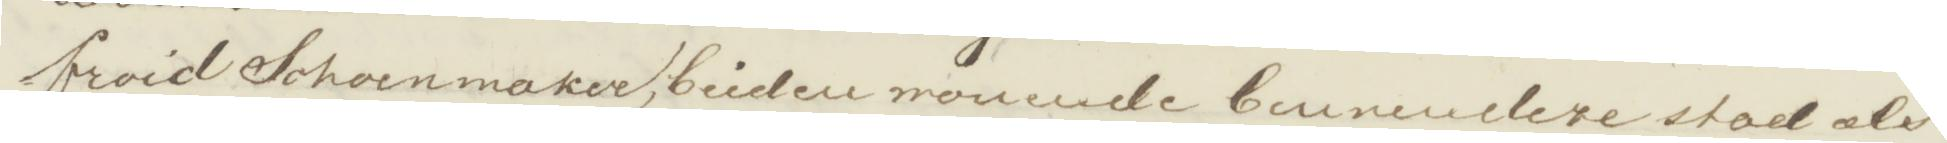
froid Schoenmaker, beiden wonende binnen deze stad als
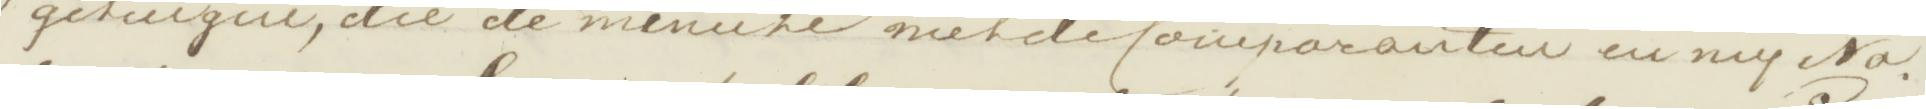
getuigen, die de minute met de Comparanten en my No,
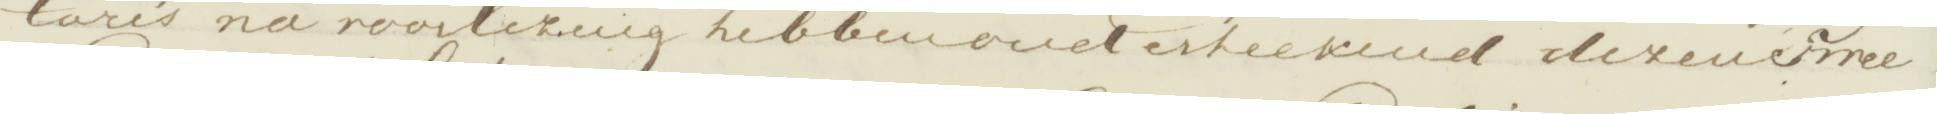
taris na voorlezing hebben onderteekend dezen Twee
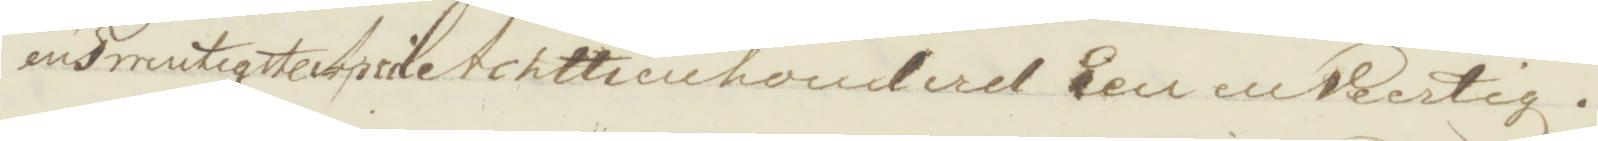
en Twintigste April Achttienhonderd Een en Veertig.
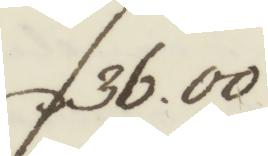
ƒ36.00
